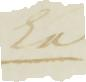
ha
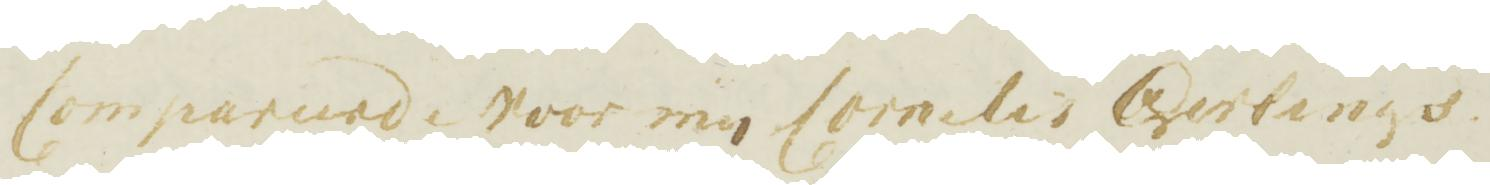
Compareerde voor mij Cornelis Gerlings.
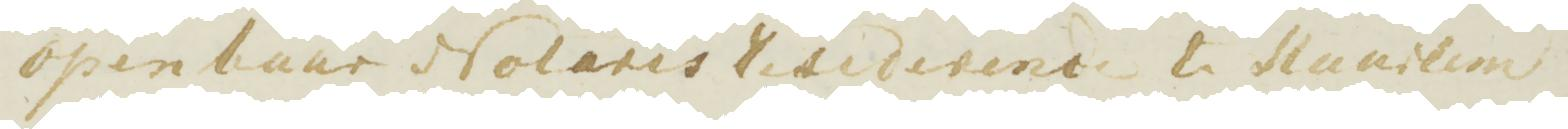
Openbaar Notaris residerende te Haarlem
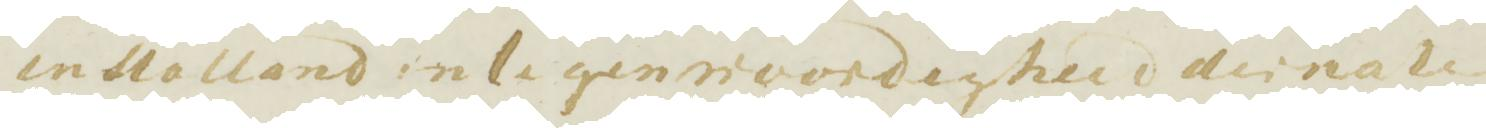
in Holland in tegenwoordigheid der nate
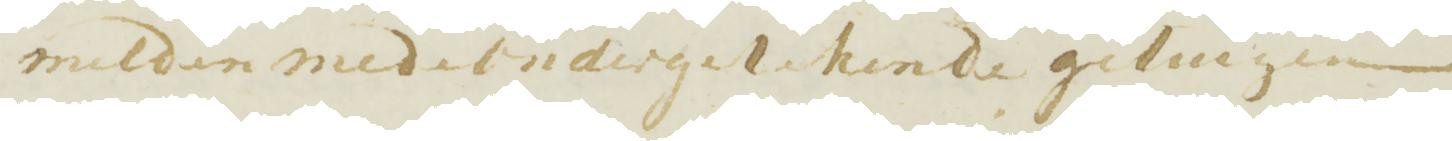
melden mede ondergetekende getuigen
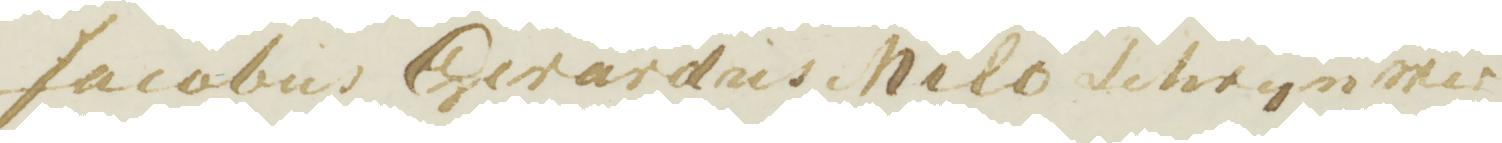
Jacobus Gerardus Milo Schrynwer
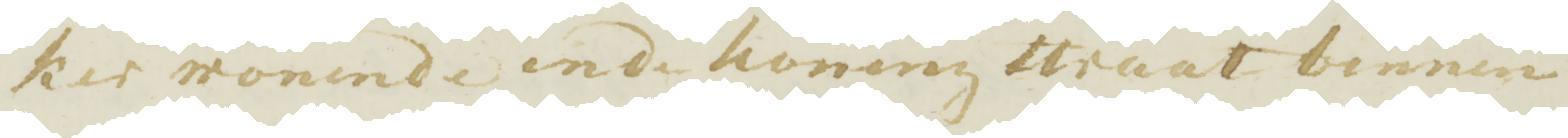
ker wonende inde koning straat binnen
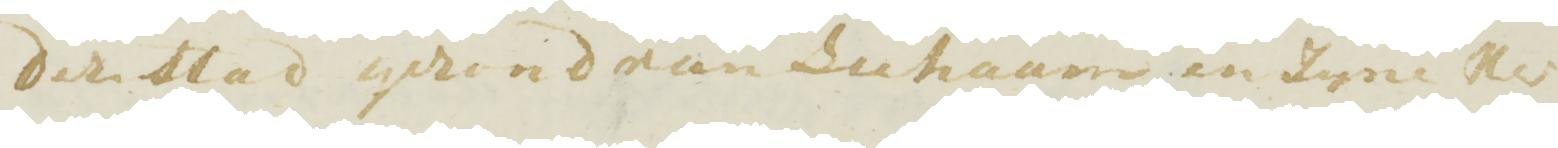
deze stad gezond van Lichaam en zyne Ver
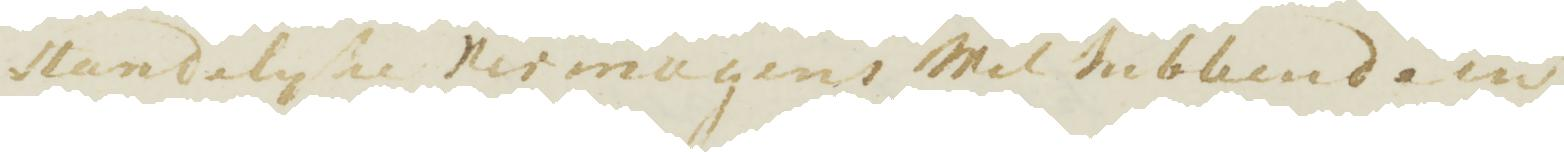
standelyke vermogens wel hebbende en
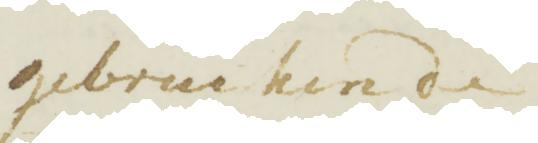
gebruikende
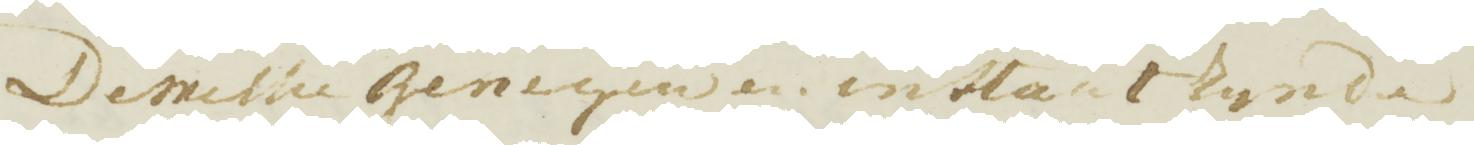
Dewelke genegen en in staat zynde
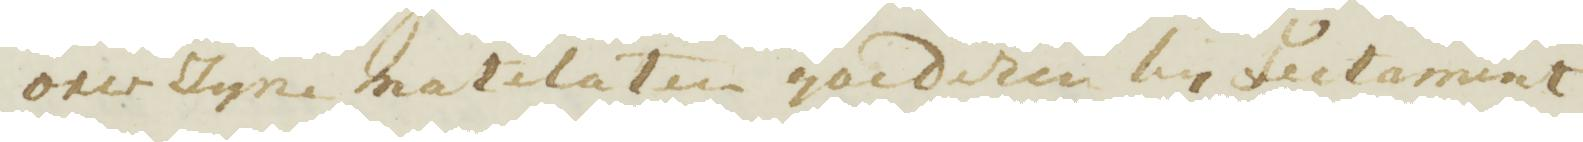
over zyne natelaten goederen by Testament
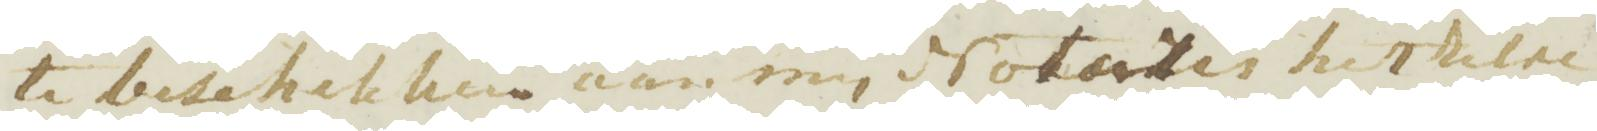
te beschikken aan mij Notaris het zelve
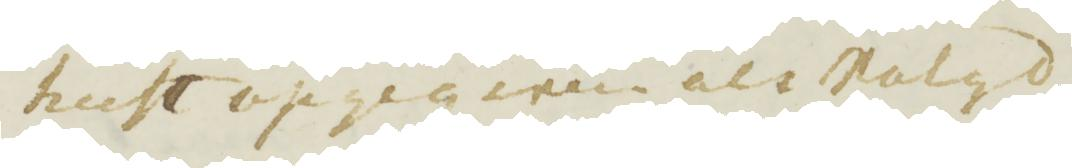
heeft opgegeven als volgd
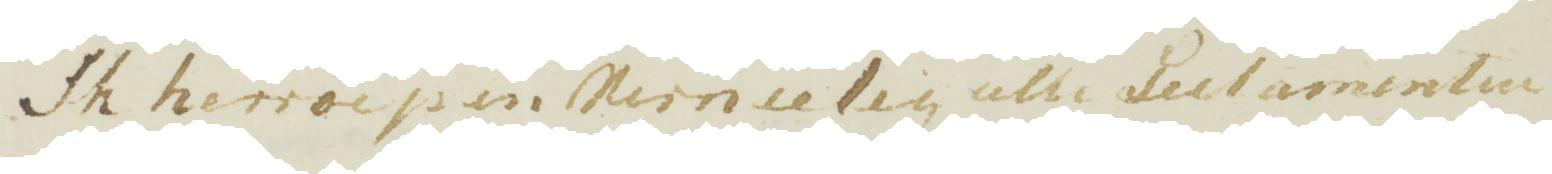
Ik herroep en Vernietig alle Testamenten
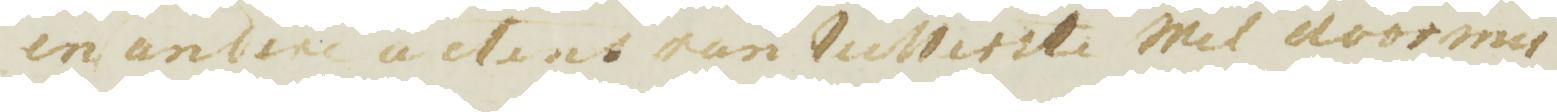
en andere actens van Uitterste wil door mij
